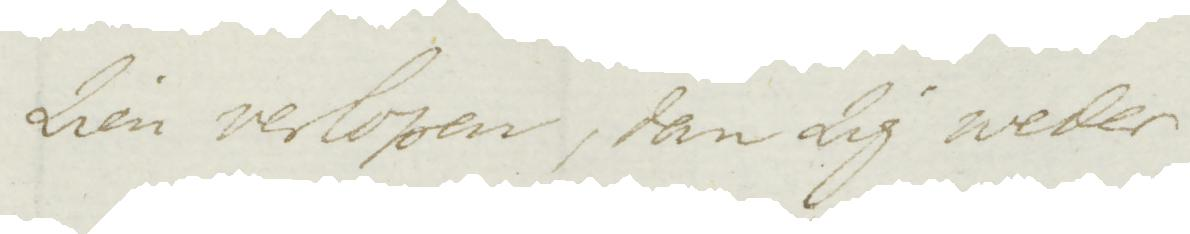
zien verlopen, dan zig weder
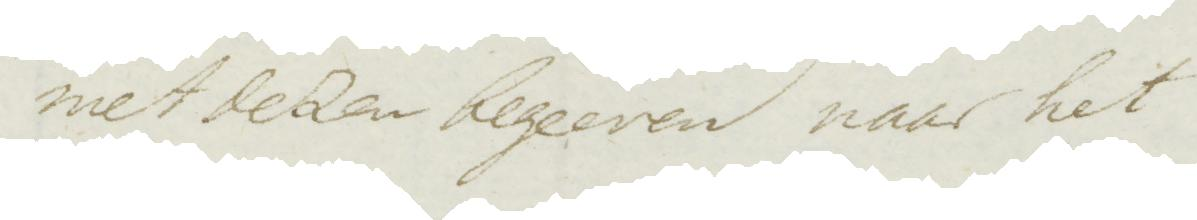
met dezen begeeven naar het
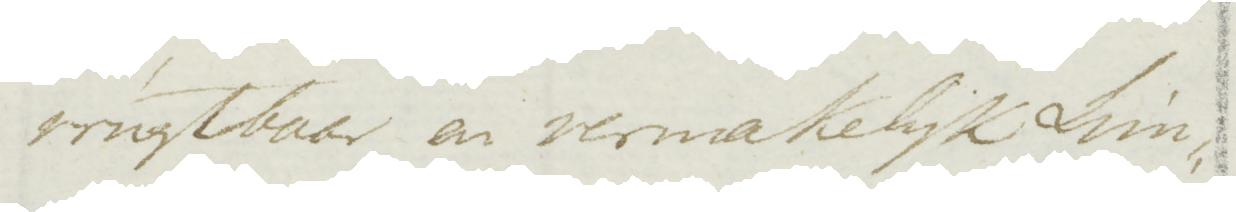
vrugtbaar en vermakelijk Lim„
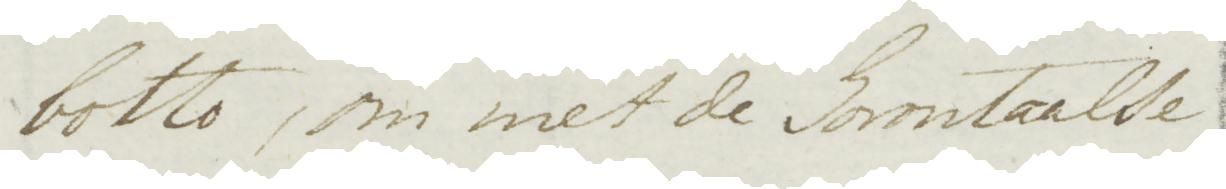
botto, om met de Gorontaalse
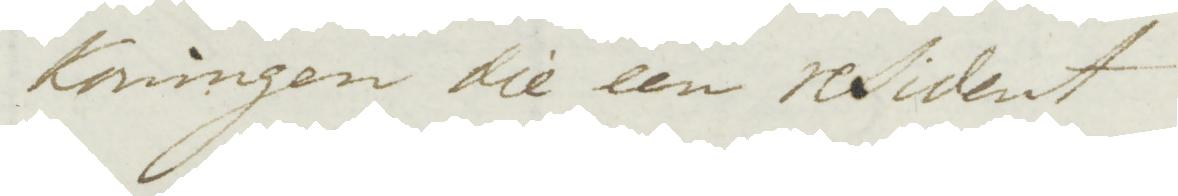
koningen die een resident
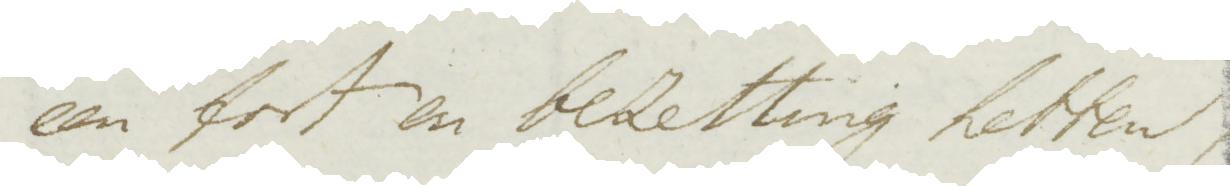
een fort en bezetting hebben,
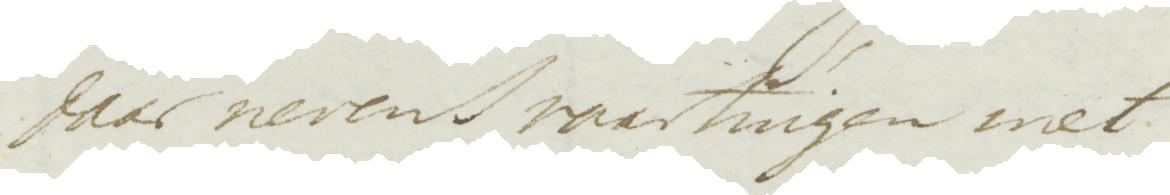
daar nevens vaartuigen met
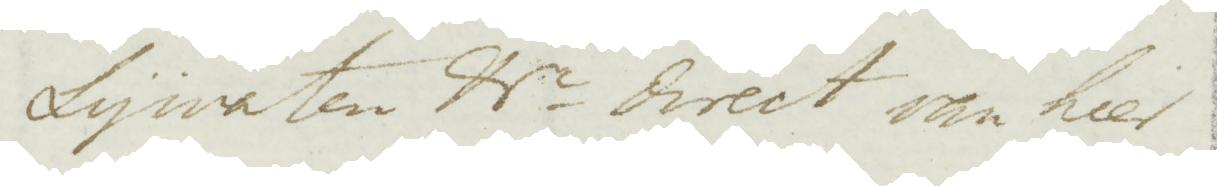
Lijwaten Et=a direct van hier
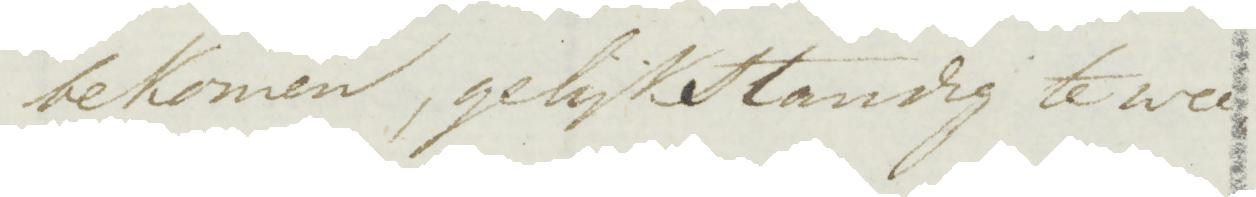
bekomen, gelijkstandig te wee
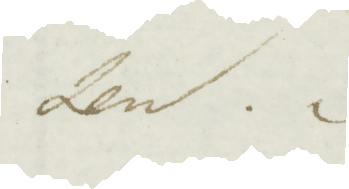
zen. -
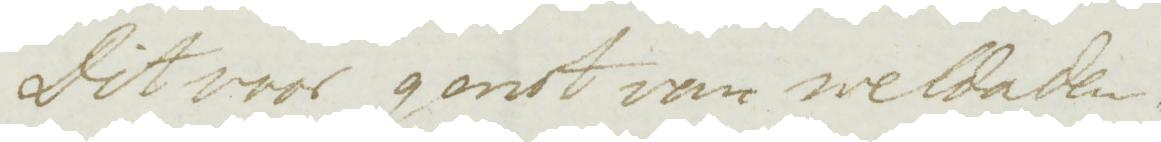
Dit voor ganst van weldaden
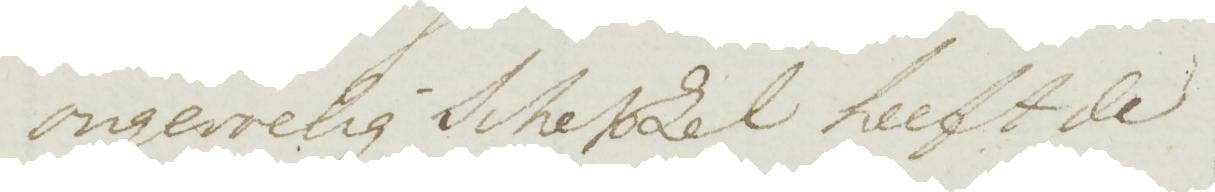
ongevoelig schepzel heeft de
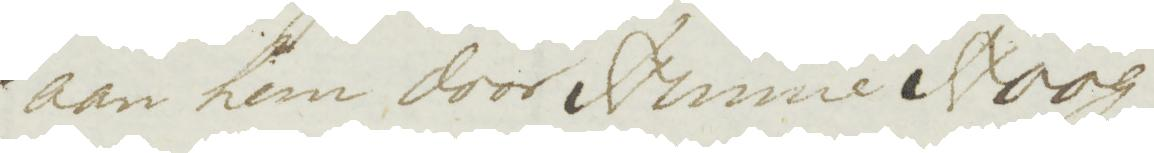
aan hem door Hunne Hoog
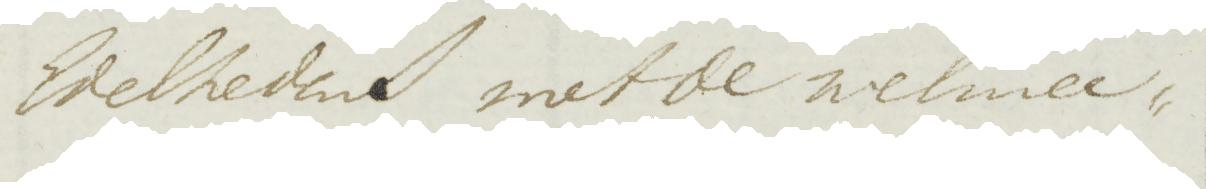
Edelhedens met de welmee„
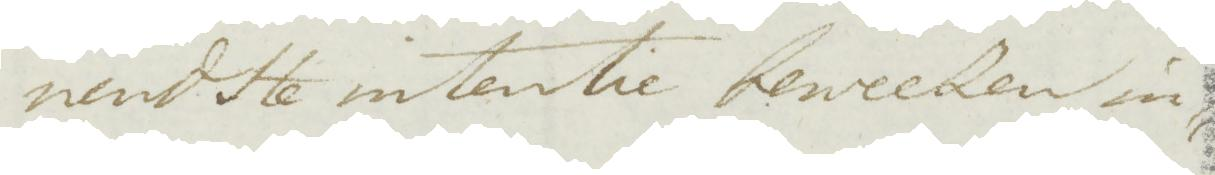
nendste intentie beweezen in
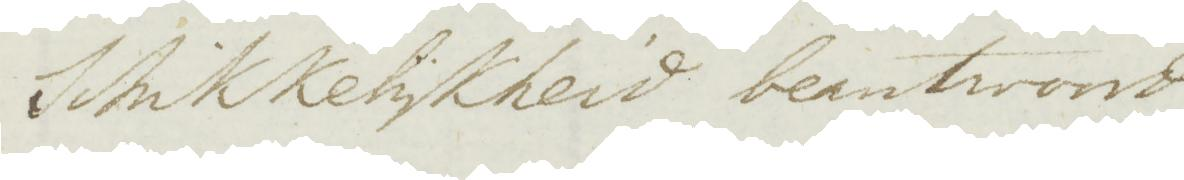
schikkelijkheid beantwoord
